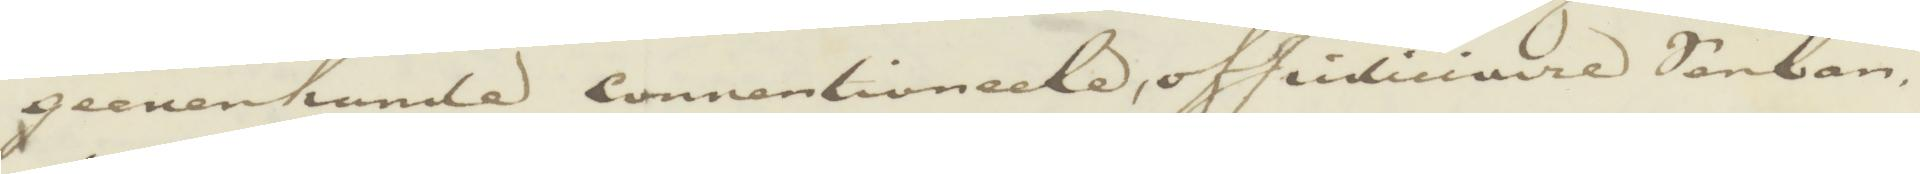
geenenhande conventioneele, of Judiciaire verban,
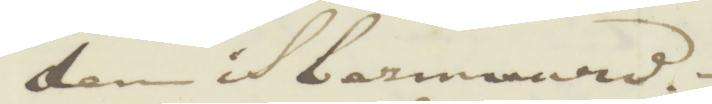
den is bezwaard.
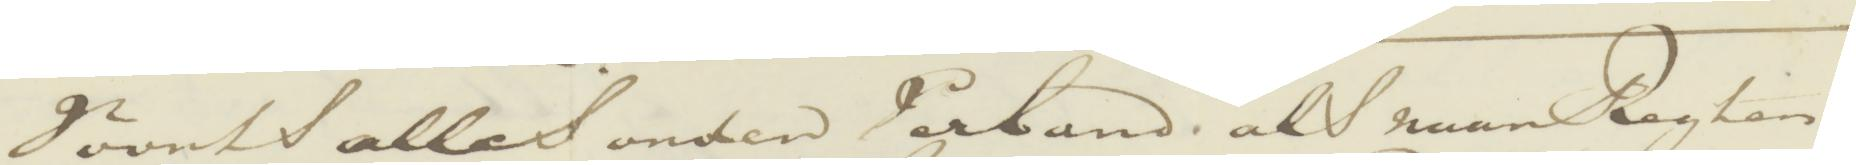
Voorts alles onder Verband, als naar Regten.
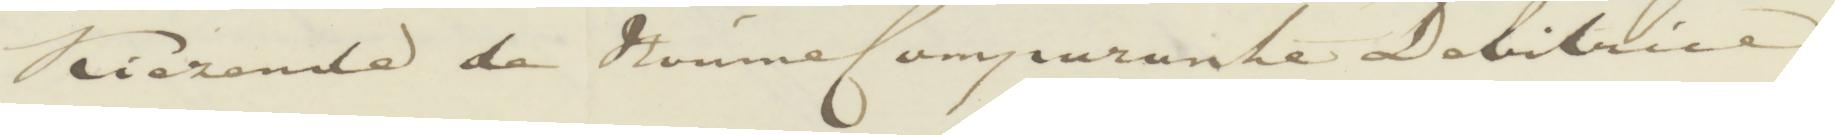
Kiezende de Vrouwe Comparante Debitrice
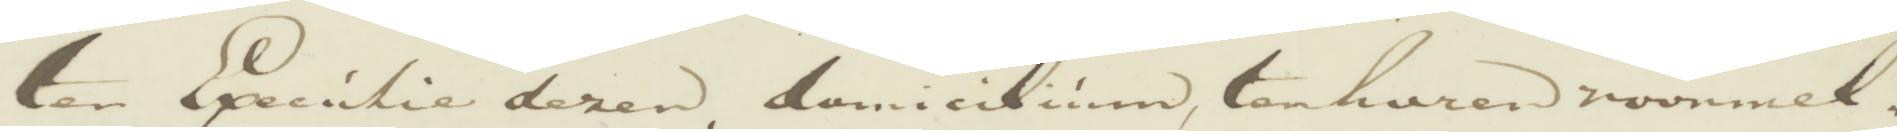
ter Executie dezen, domicilium, ten haren voormel„
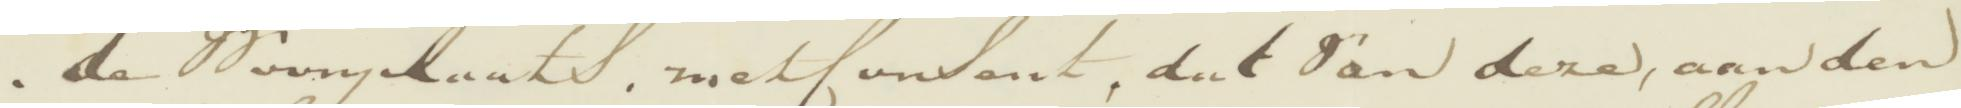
„de Woonplaats, met Consent, dat van deze, aan den
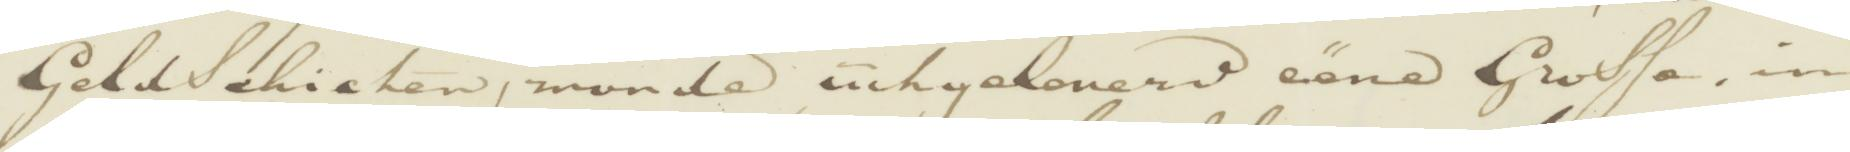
Geldschieter, worde uitgeleverd ééne Grosse, in
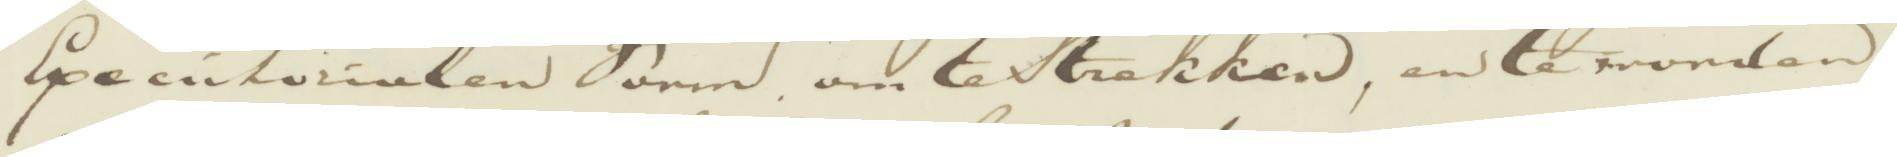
Executorielen Vorm, om te strekken, en te worden
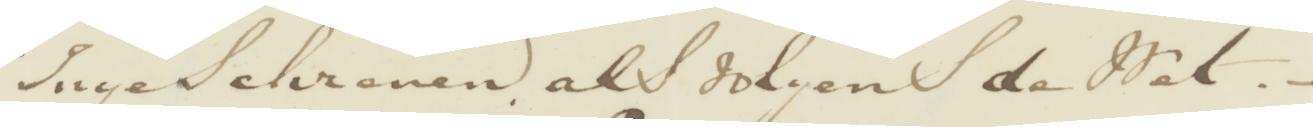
Ingeschreven, als volgens de Wet.
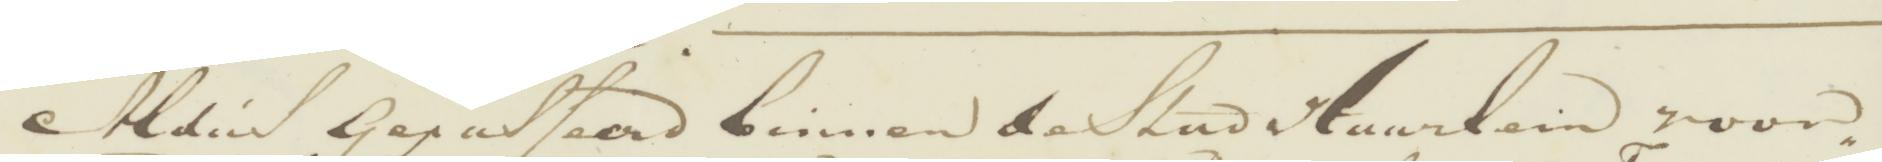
Aldus Gepasseerd binnen de stad Haarlem voor„
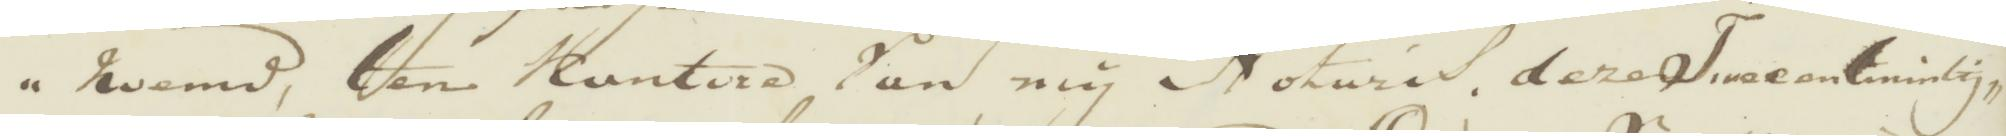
„noemd, ten Kantore van mij Notaris, deze Tweeentwintig„
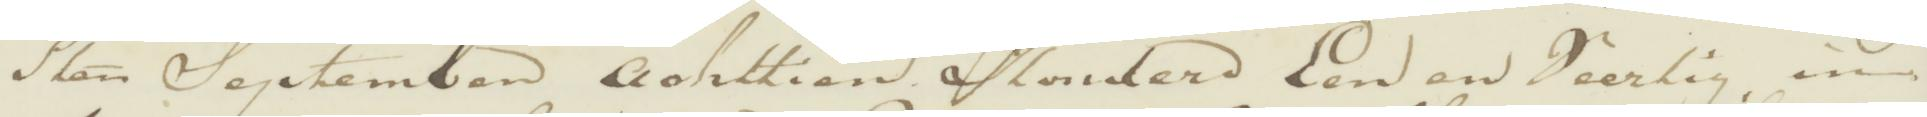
sten September achttien Honderd Een en Veertig in
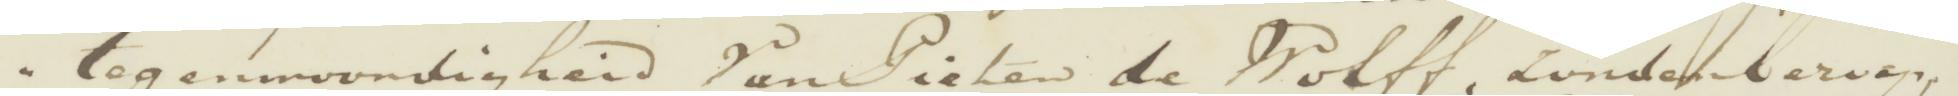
„tegenwoordigheid van Pieter de Wolff, zonder beroep,
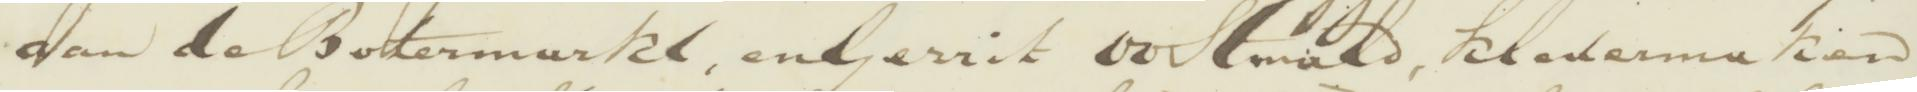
aan de Botermarkt, en Gerrit Oostwald, kledermaker
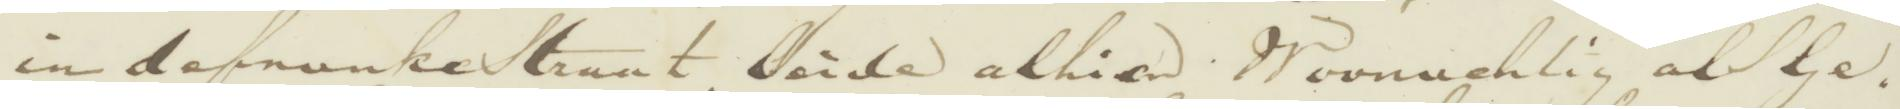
in de frankestraat, beide alhier Woonachtig als Ge„
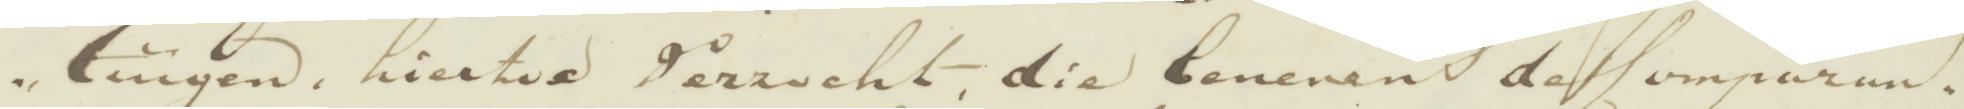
„tuigen, hiertoe Verzocht, die benevens de Comparan„
